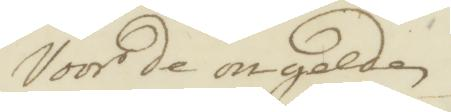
voor de ongelden
